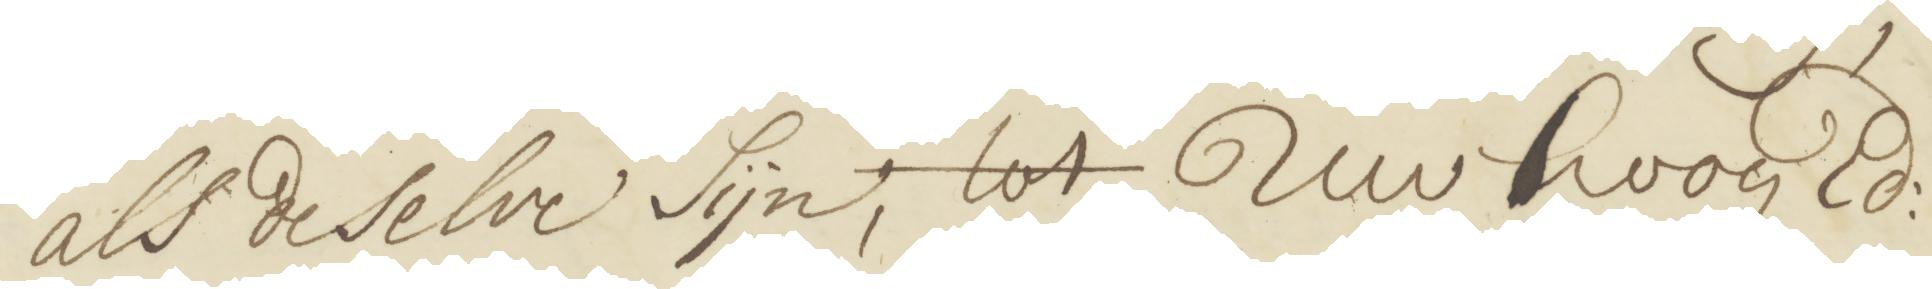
als deselve sijn, tot uw hoog Ed:
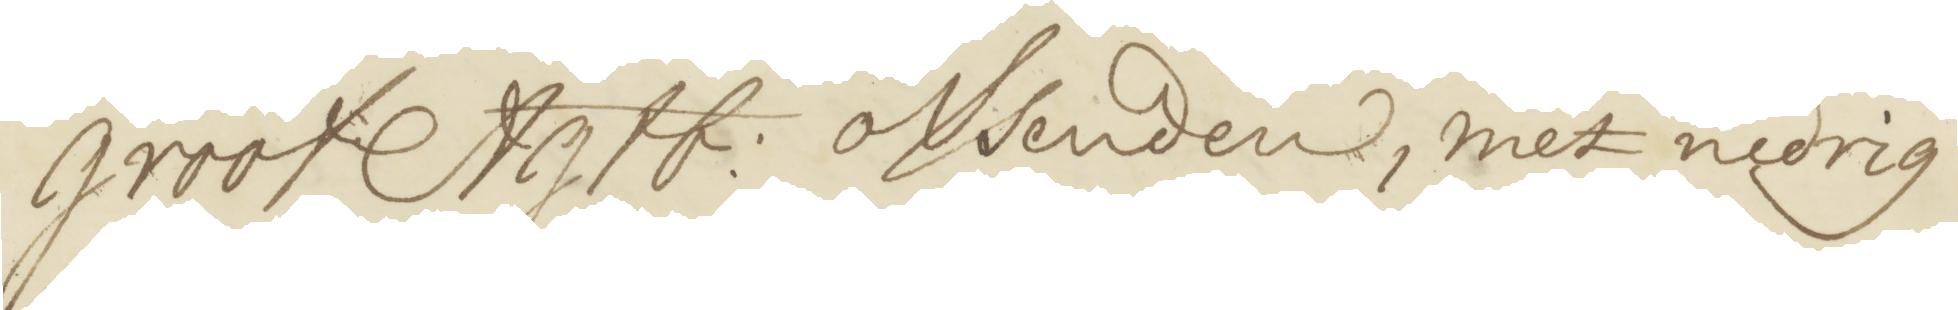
groot Agtb: oversenden, met nedrig
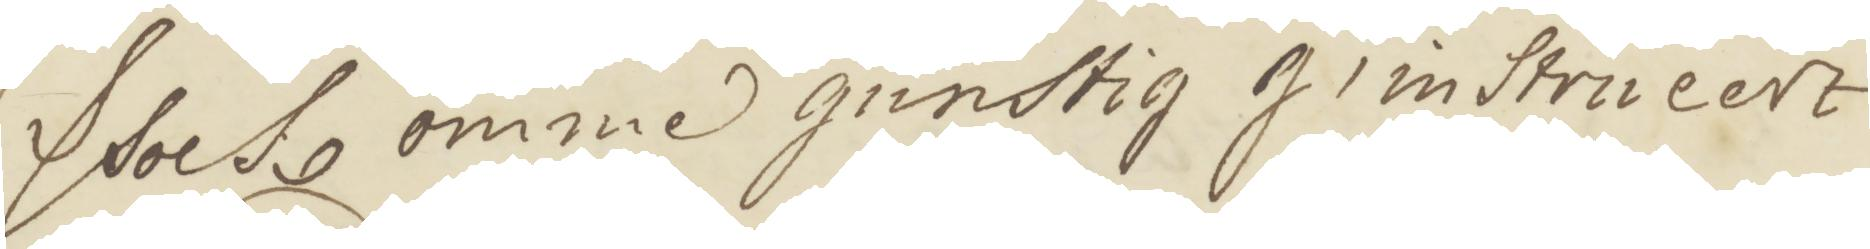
versoek omme gunstig g' instrueert
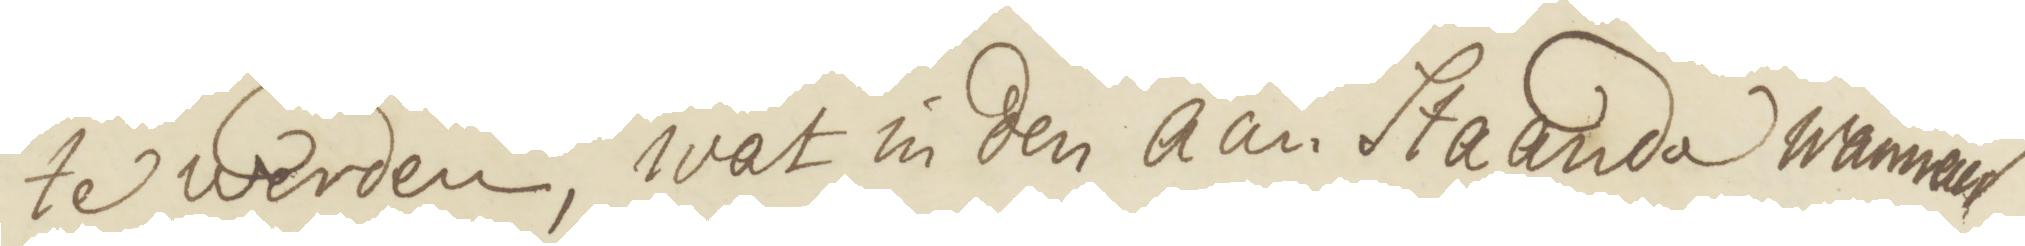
te werden, wat in den aan staande wanneer
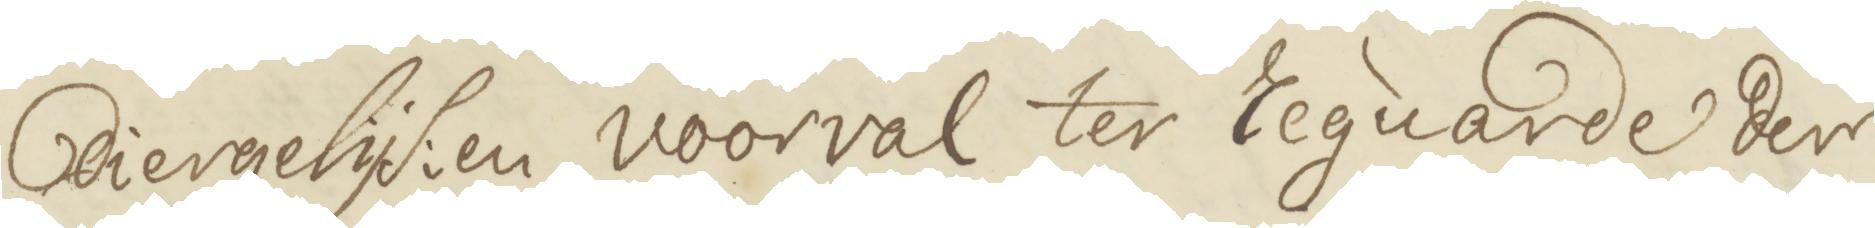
diergelijken voorval ter reguarde der
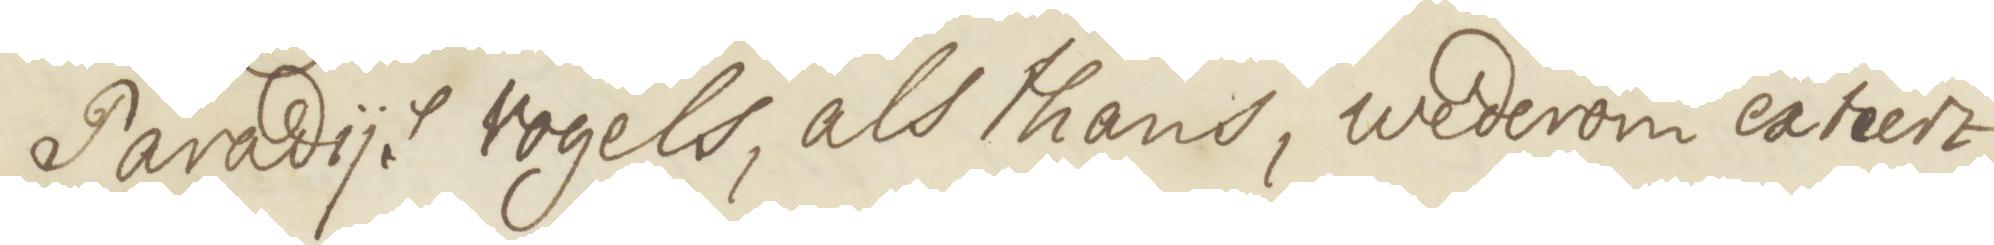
Paradijs vogels, als thans, wederom cateert,
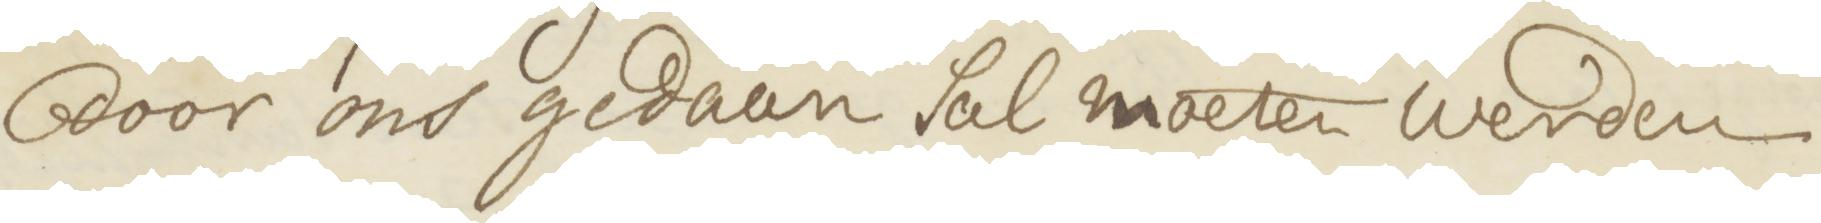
door ons gedaan sal moeten werden.
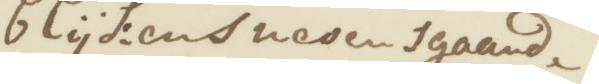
blijkens nevensgaende
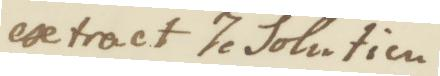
extract tresolutien
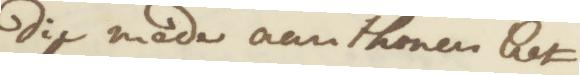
die mede aanthonen het
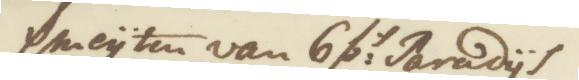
vermeijten van 6 p„s Paradijs
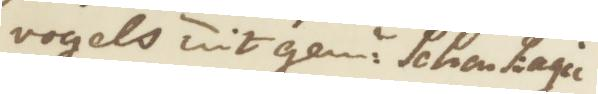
vogels uit gem:e schenkagie
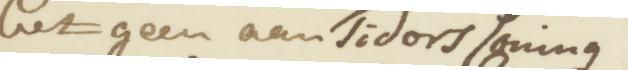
het geen aan Tidors Coning
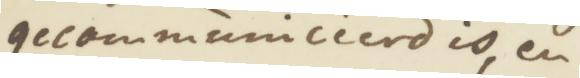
gecommuniceerd is, en
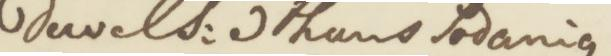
dewels=e thans sodanig
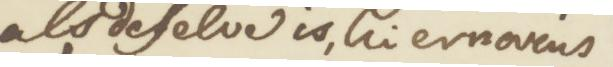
als deselve is, hiernevens
